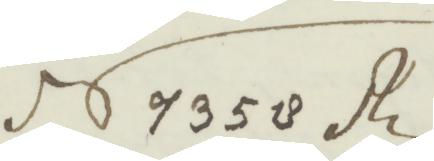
N7358 Re
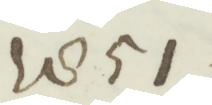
1851
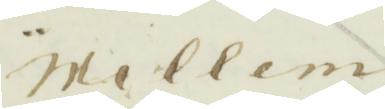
Willem
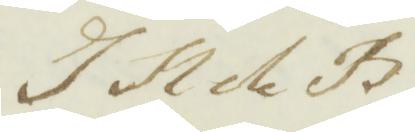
J A de B
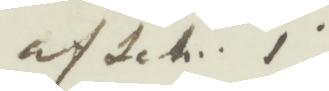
afschr. 1
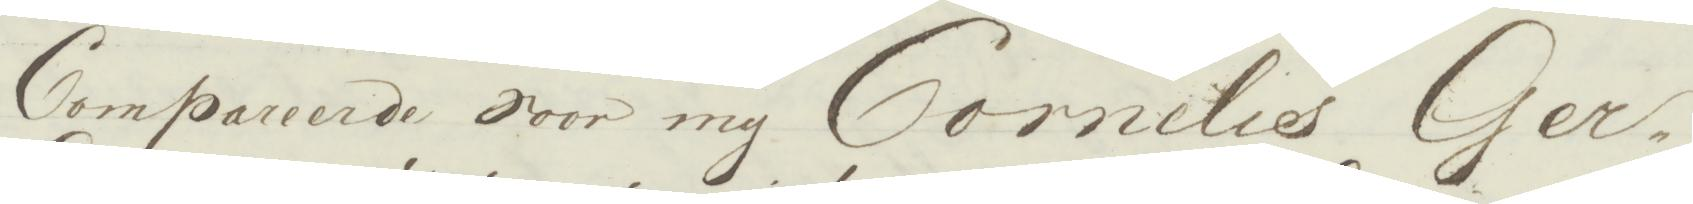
Compareerde voor my Cornelis Ger„
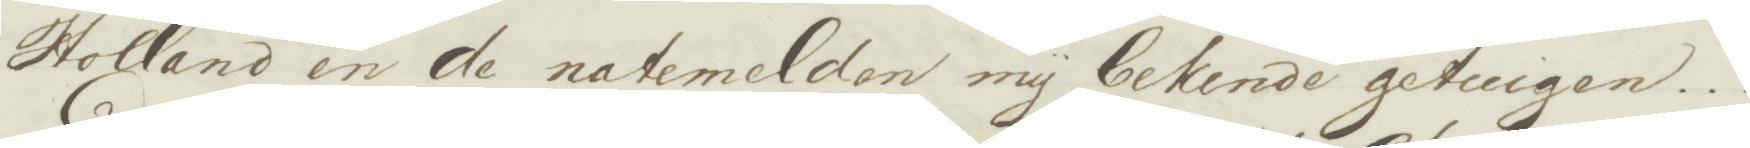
Holland en de natemelden mij bekende getuigen . .
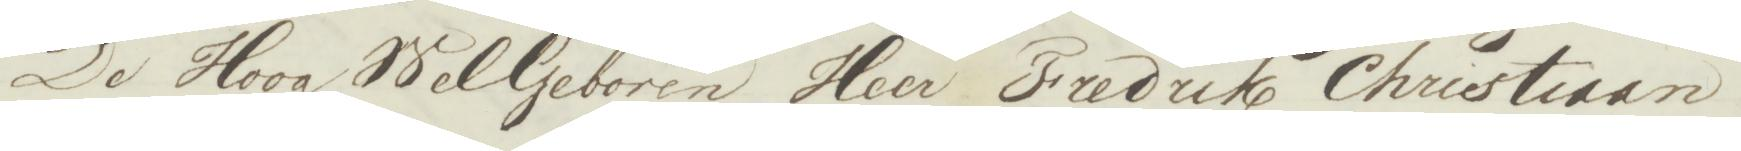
De Hoog WelGeboren Heer Fredrik Christiaan
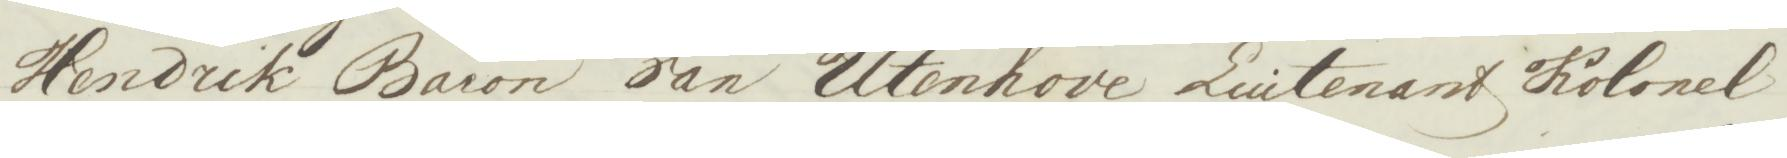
Hendrik Baron van Utenhove Luitenant Kolonel
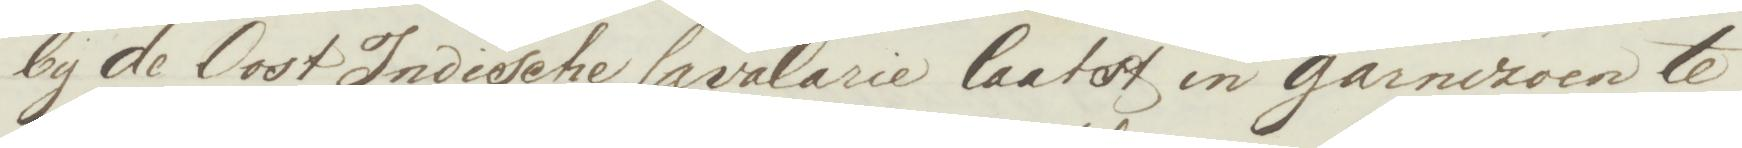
bij de Oost Indische Cavalarie laatst in garnizoen te
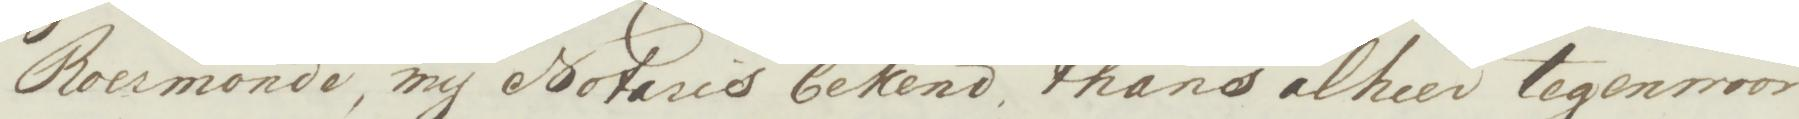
Roermonde, mij Notaris bekend, thans alhier tegenwoor
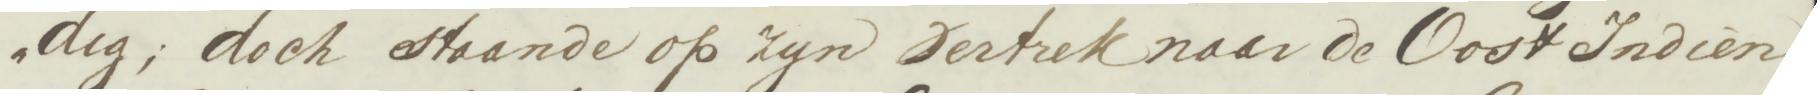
„dig; doch staande op zyn vertrek naar de Oost Indien
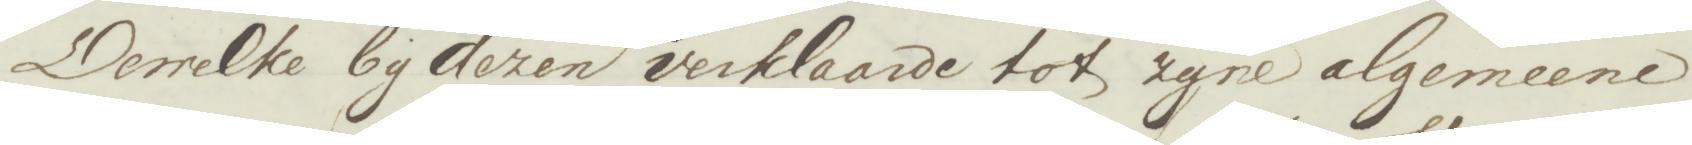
Dewelke bij dezen verklaarde tot zyne algemeene
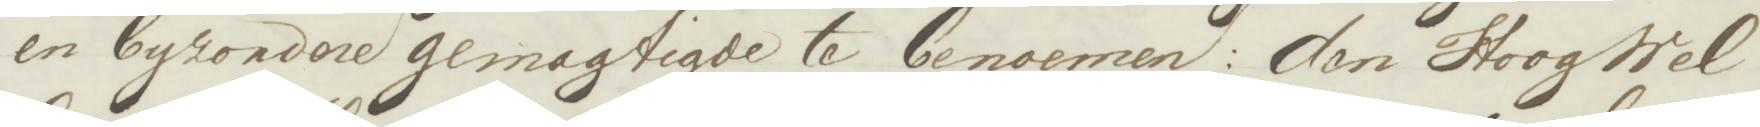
en byzondere gemagtigde te benoemen: den HoogWel
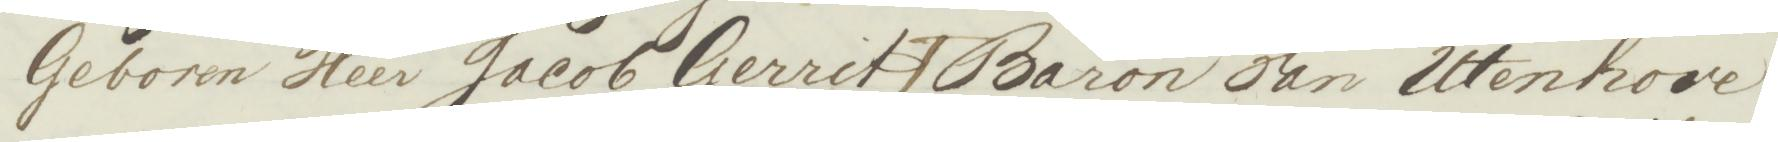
Geboren Heer Jacob Gerrit ¶ Baron van Utenhove
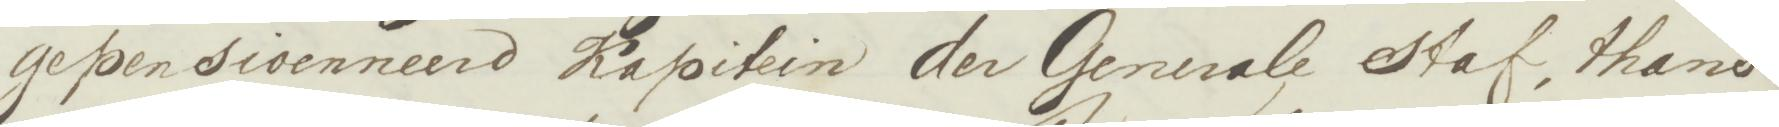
gepensioenneerd Kapitein der Generale Staf, thans
